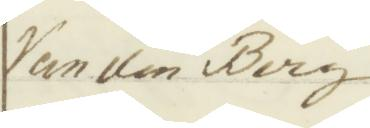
Van den Berg
